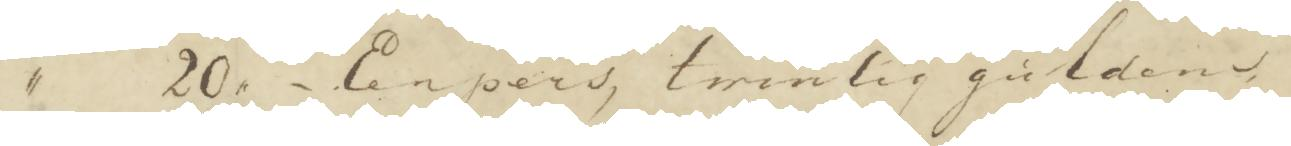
„ 20„ -. Een pers, twintig guldens
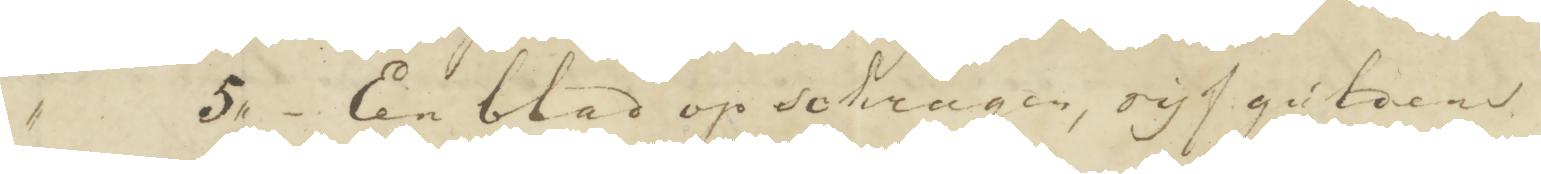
„ 5„ -. Een blad op schragen, vijf guldens
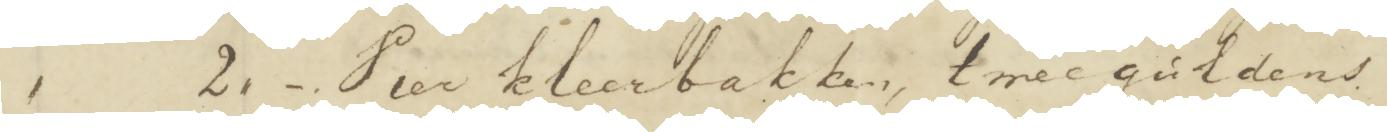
„ 2„ -. Vier kleerbakken, twee guldens.
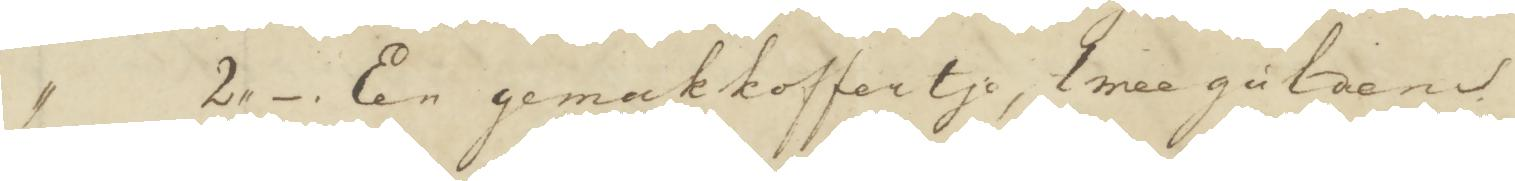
„ 2„ -. Een gemak koffertje, twee guldens.
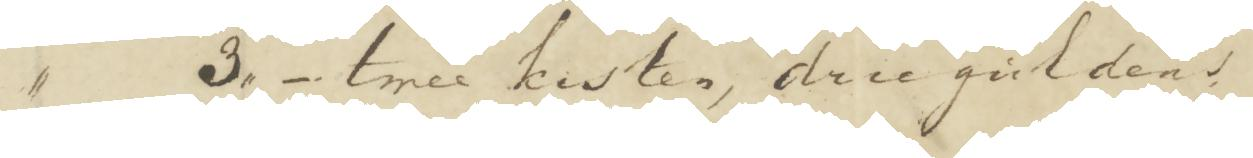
„ 3„ -. twee kisten, drie guldens
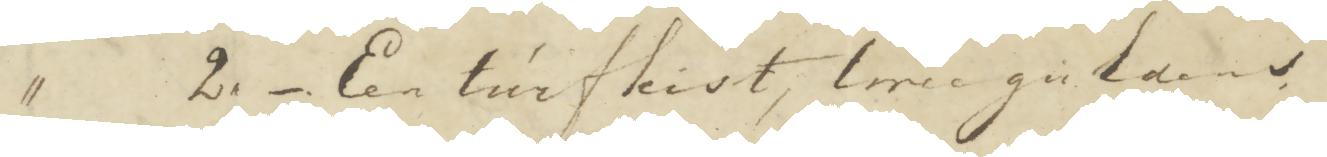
„ 2„ -. Een turfkist, twee guldens
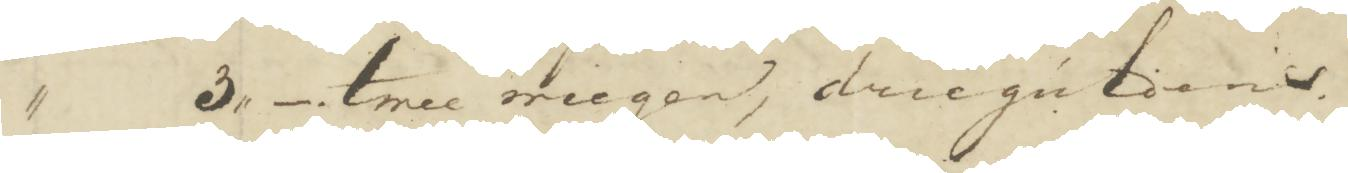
„ 3„ -. twee wiegen, drie guldens
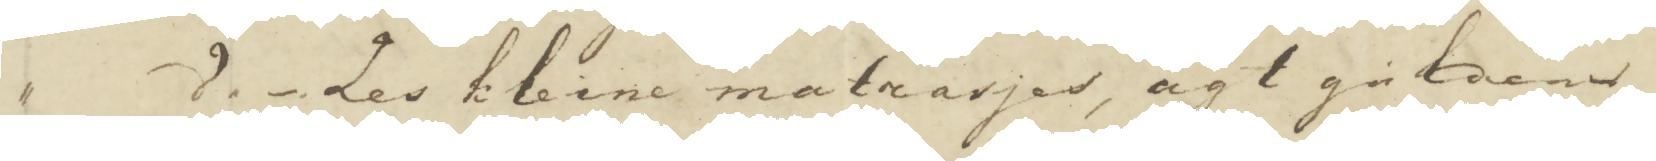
„8„ -. Zes kleine matrasjes, agt guldens
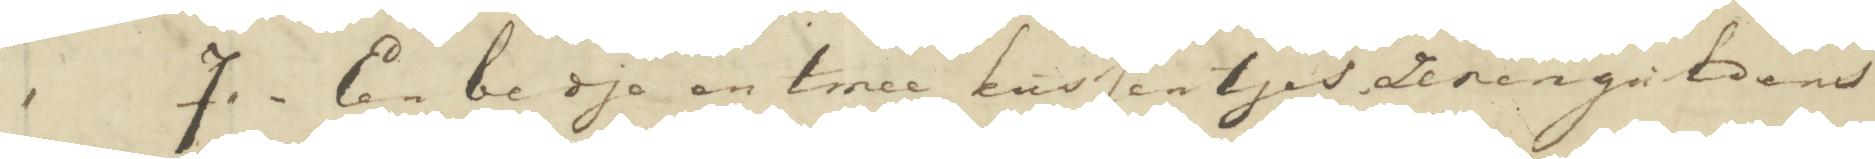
„ 7„ - Een bedje en twee kussentjes zeven guldens
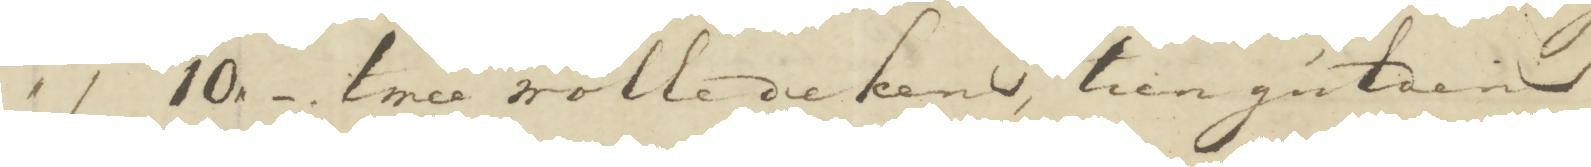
„ 10„ -. twee wolle dekens, tien guldens
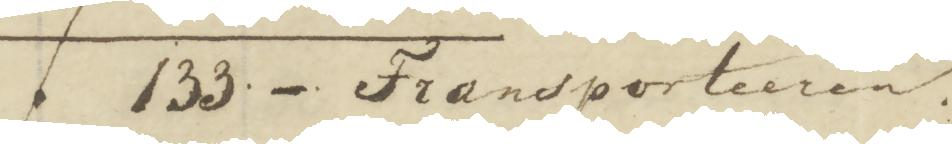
ƒ 133 -. Transporteeren.
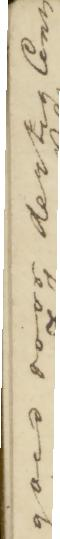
goed voor, dertig Cent
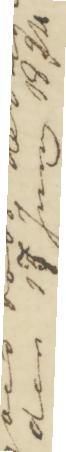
den 17 Junij 1824
